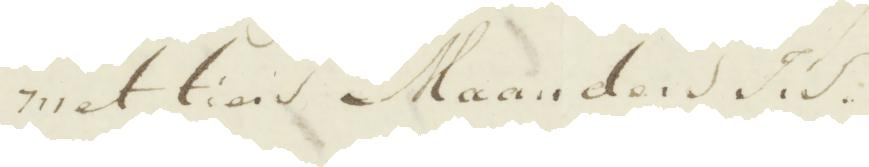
met tien Maanden In.
